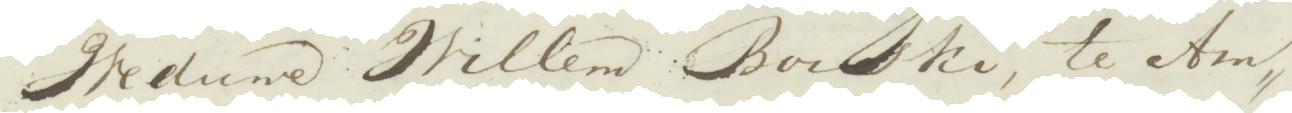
Weduwe Willem Borski, te Am„
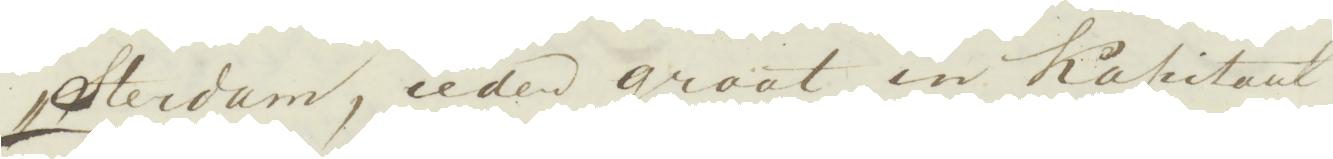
„sterdam, ieder groot in Kapitaal
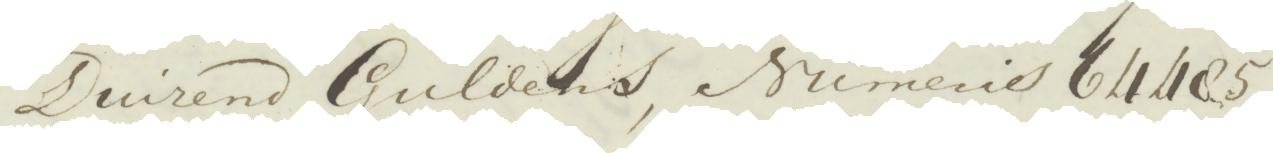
Duizend Guldens, Numeris 64485,
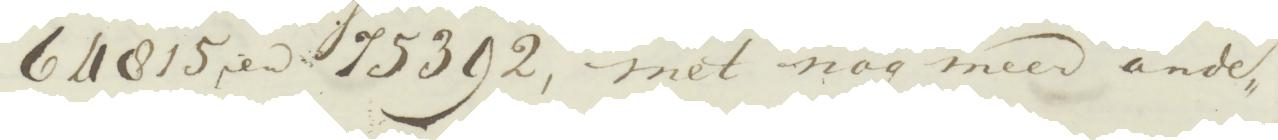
64815, en 75392, met nog meer ande„
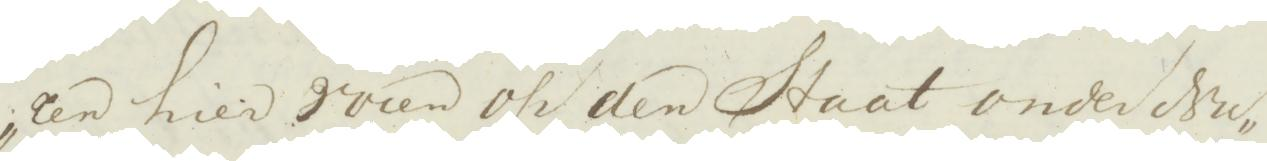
„ren hier voren op den Staat onder Nu„
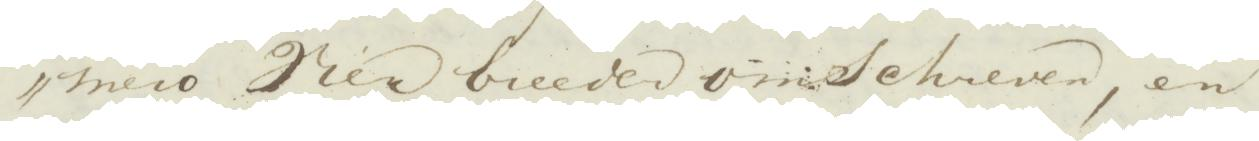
„mero Vier breeder omschreven, en
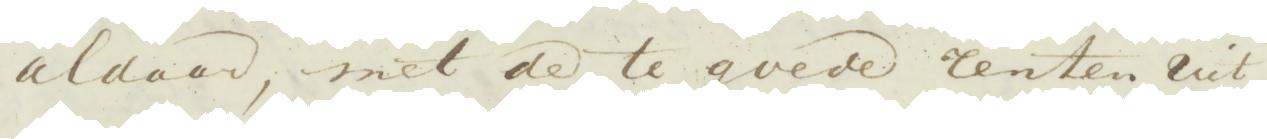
aldaar, met de te goede renten uit
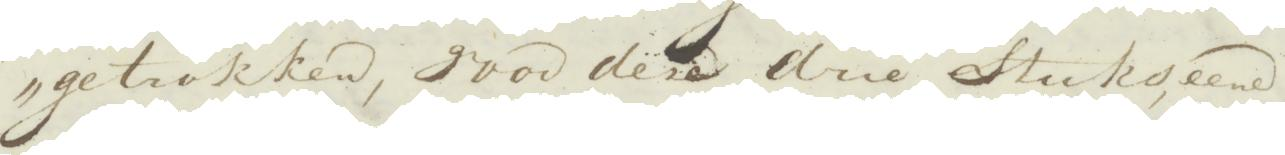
„getrokken, voor deze drie stuks, eene
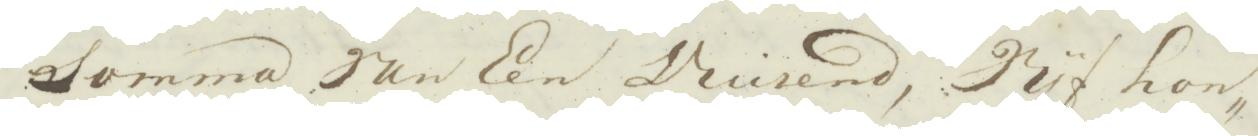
somma van Een Duizend, Vijf hon„
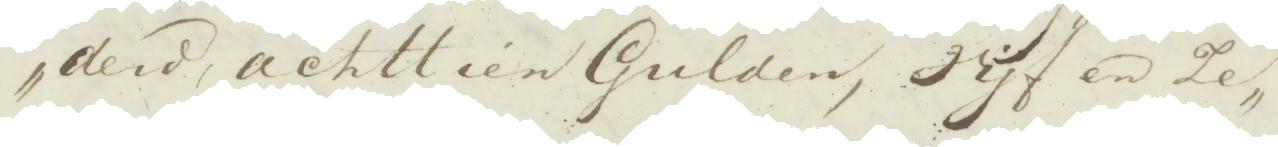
„derd, achttien Gulden, Vijf en Ze„
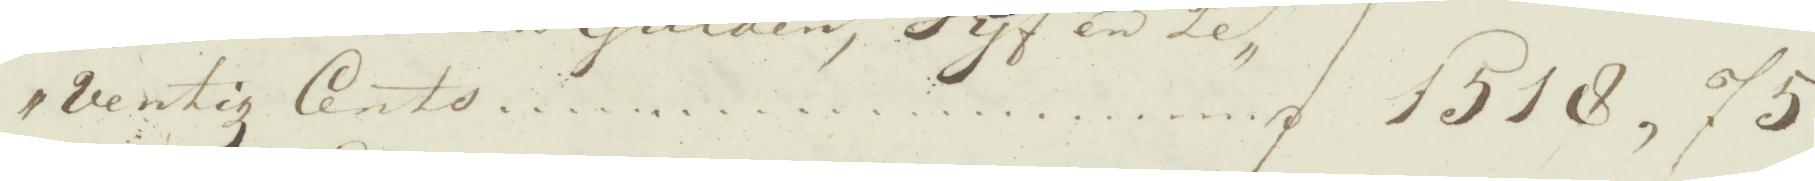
„ventig Cents . . . . . . . . . . . . . . . . . . . . . . . . ƒ 1518„75
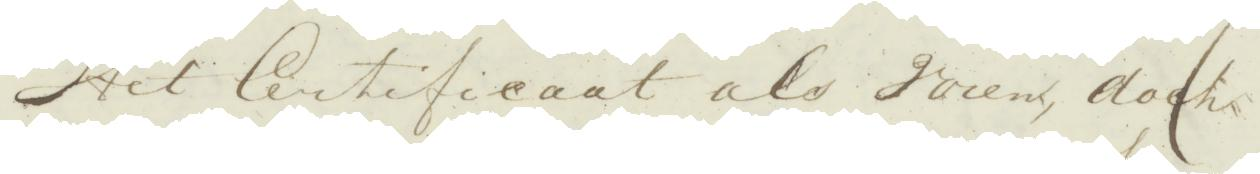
Het Certificaat als Voren, doch
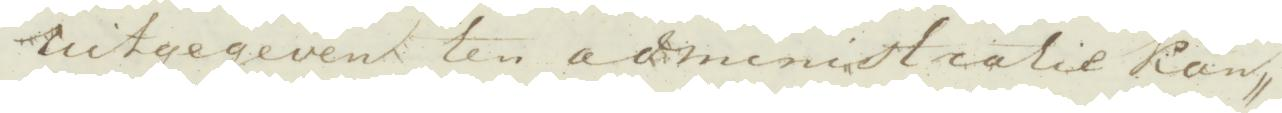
uitgegeven ten administratie kan„
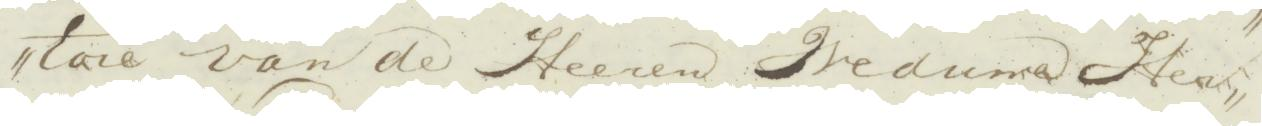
„tore van de Heeren Weduwe Her„
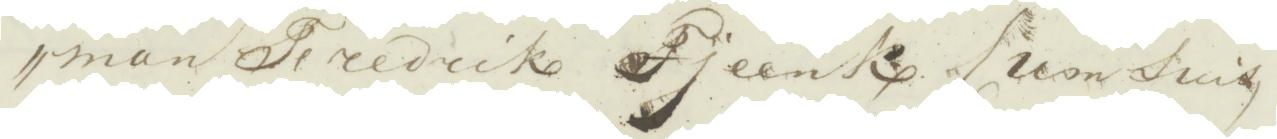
„man Fredrik Tjeenk Cum suis
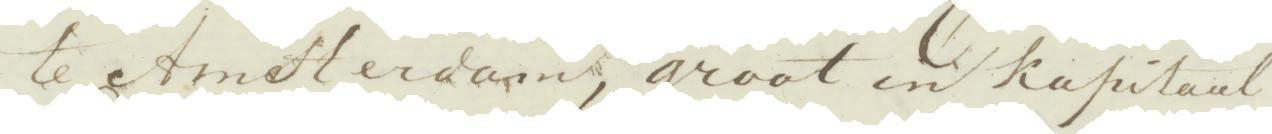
te Amsterdam, groot in kapitaal
